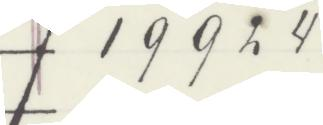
ƒ 19924
